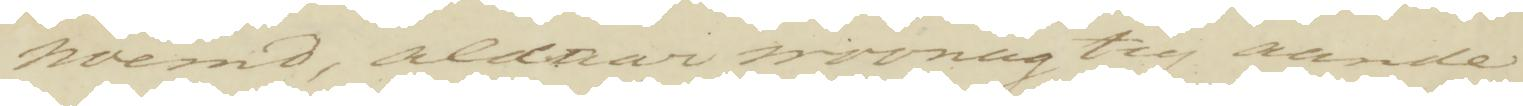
noemd, aldaar woonagtig aande
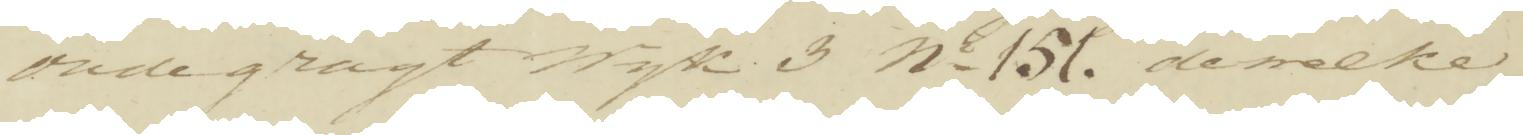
oude gragt wijk 3 N=o 151. de welke
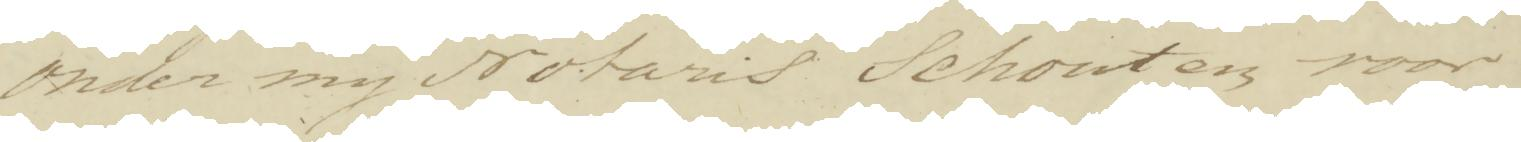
onder my Notaris Schouten voor
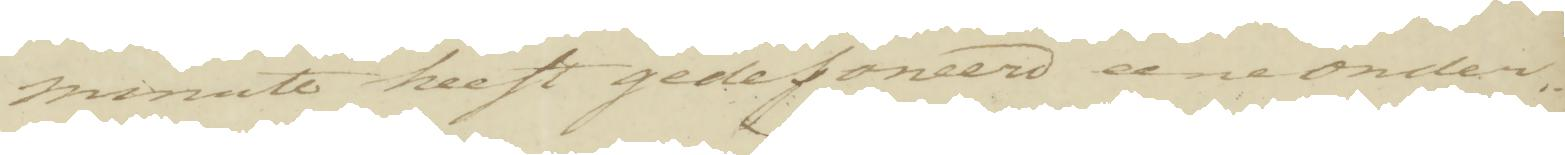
minute heeft gedeponeerd eene onder„
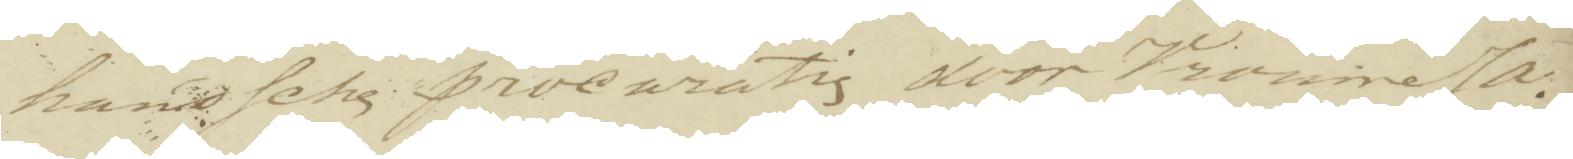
handsche procuratie door Vrouwe Ja„
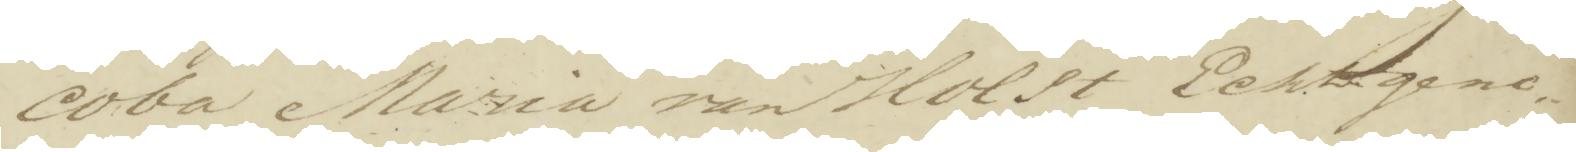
coba Maria van Holst Echtgeno„
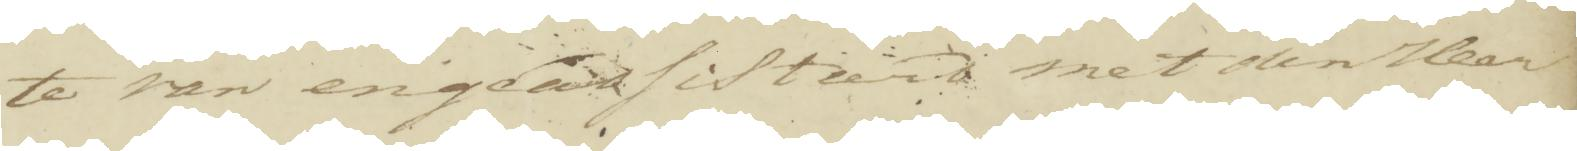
te van en geadsisteerd met den Heer
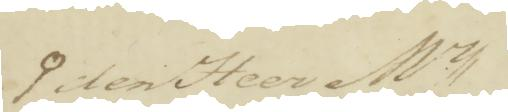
¶ den Heer M„r
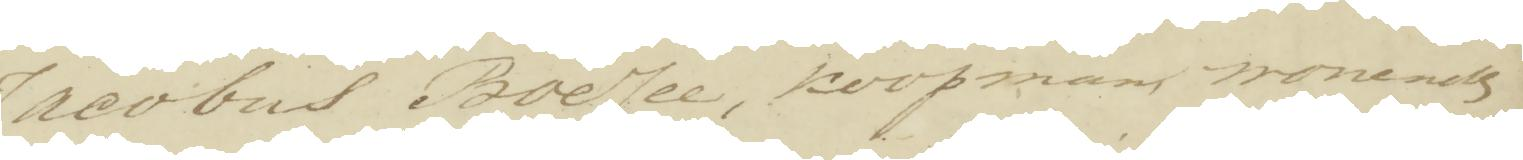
Jacobus Boejee, koopman, wonende
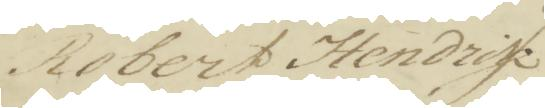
Robert Hendrik
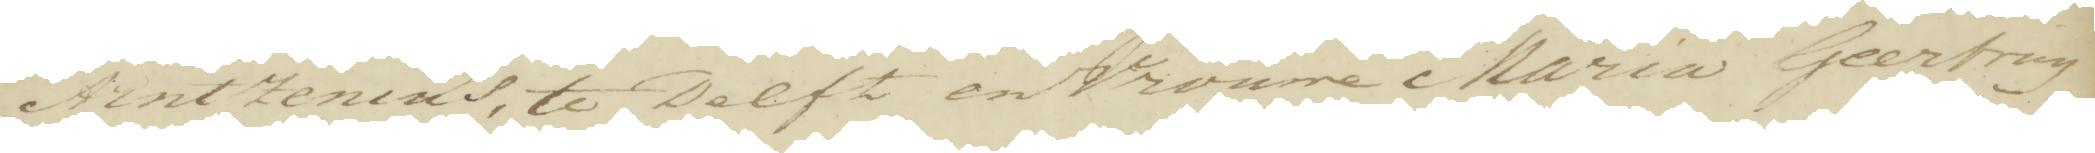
Arend Zenius, te Delft en Vrouwe Maria Geertuy
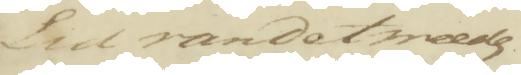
lid van de tweede
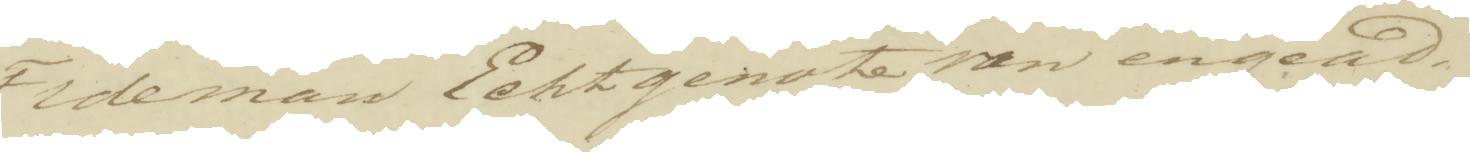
Tideman Echtgenote van en gead„
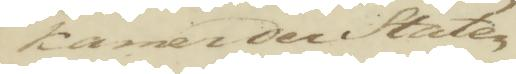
kamer der Staten
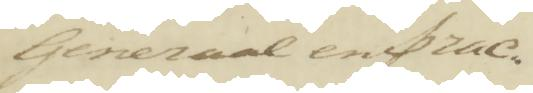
Generaal en prac„
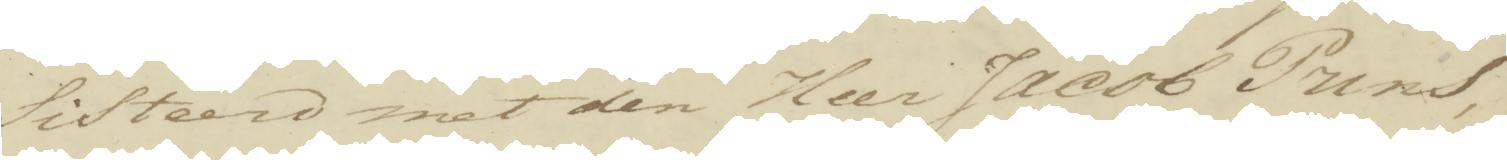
sisteerd met den Heer Jacob Prins,
